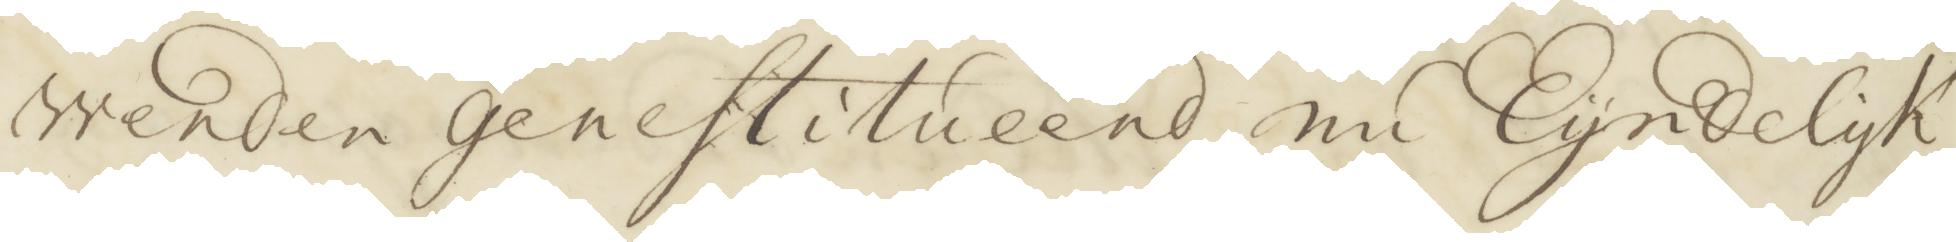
werden gerestitueerd, nu Eijndelijk
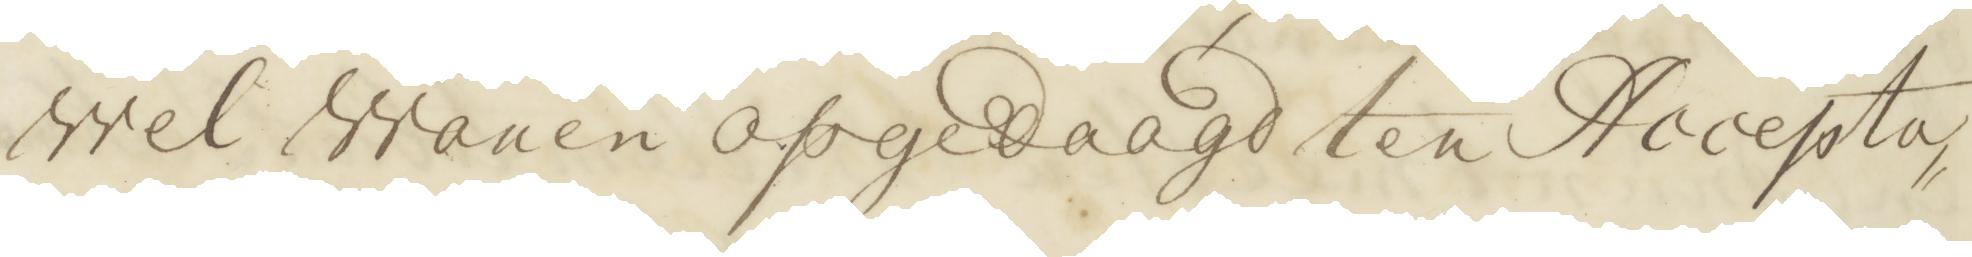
wel waren opgedaagd ter Accepta„
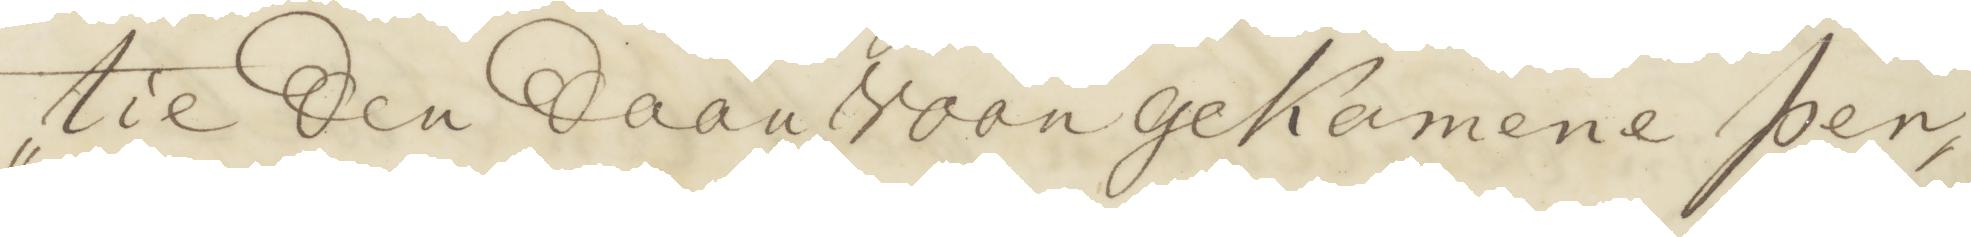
„tie der daar voor gekomene pen„
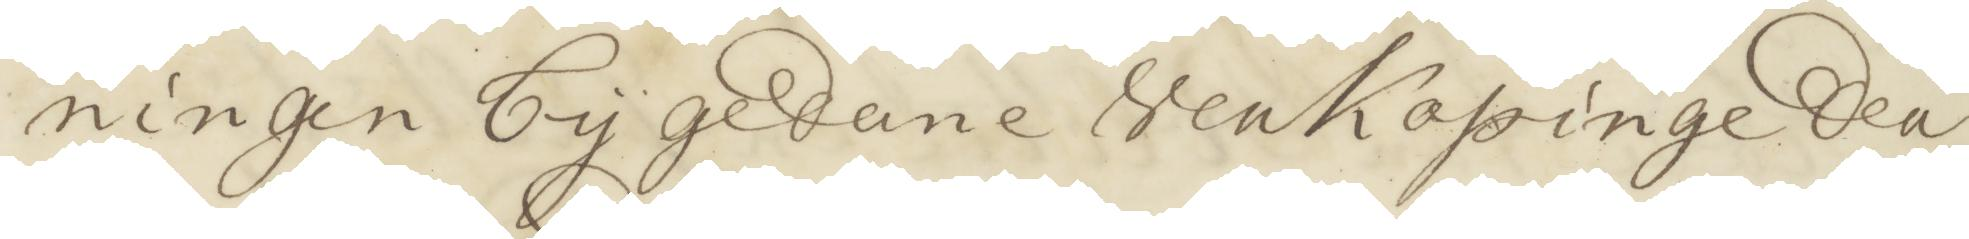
ningen bij gedane verkopinge der
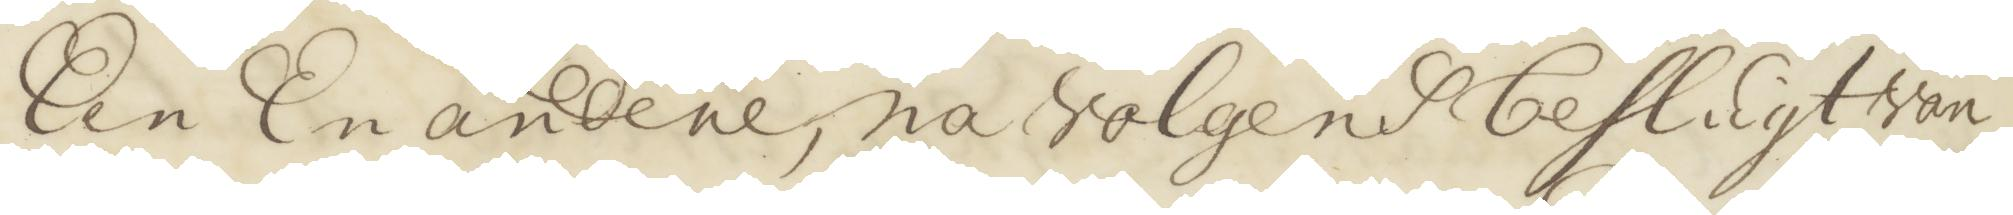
Een En andere, na volgens besluijt van
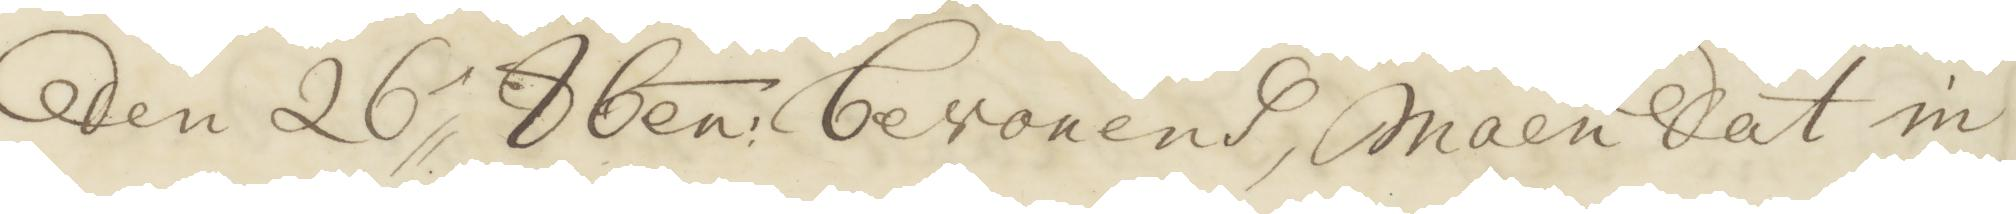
den 26„' 8ber: bevorens, maer dat in
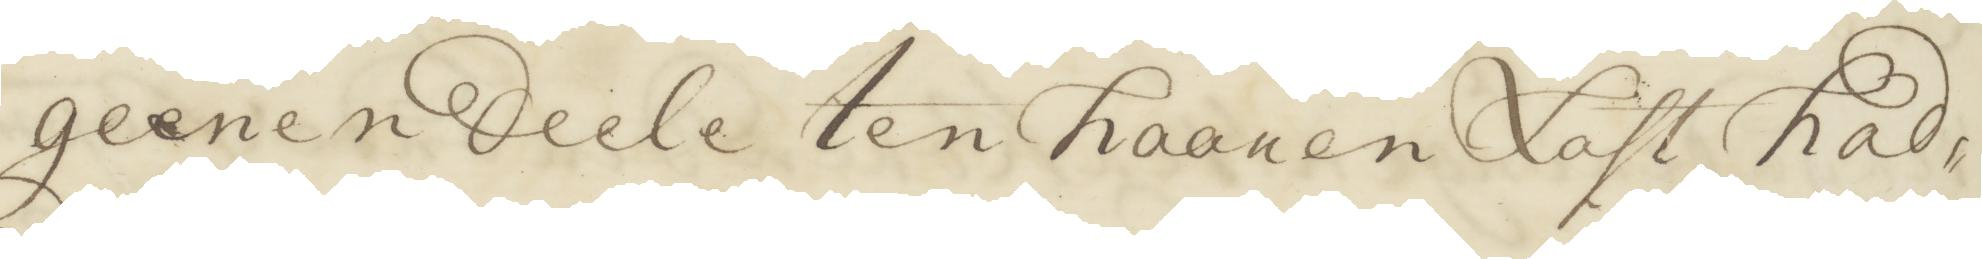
geenen deele ten haaren Last had„
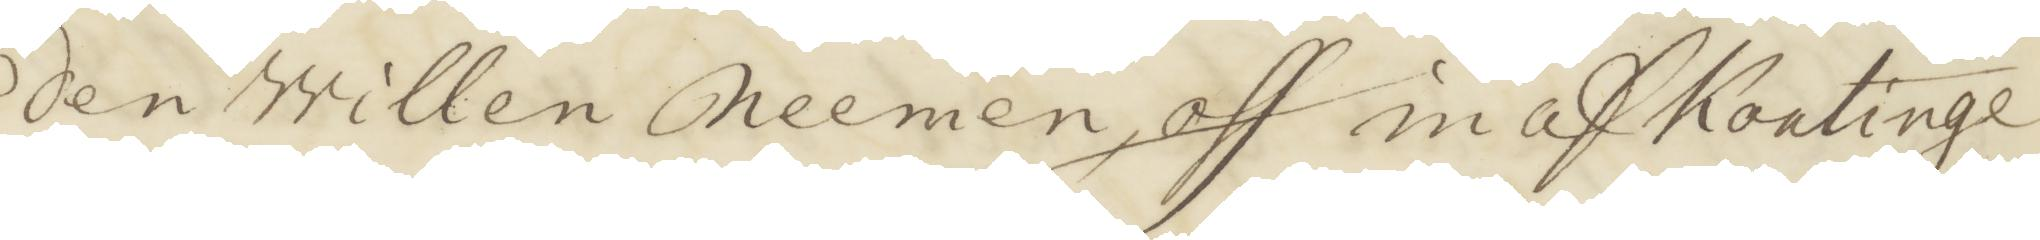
den willen neemen, off in afkortinge
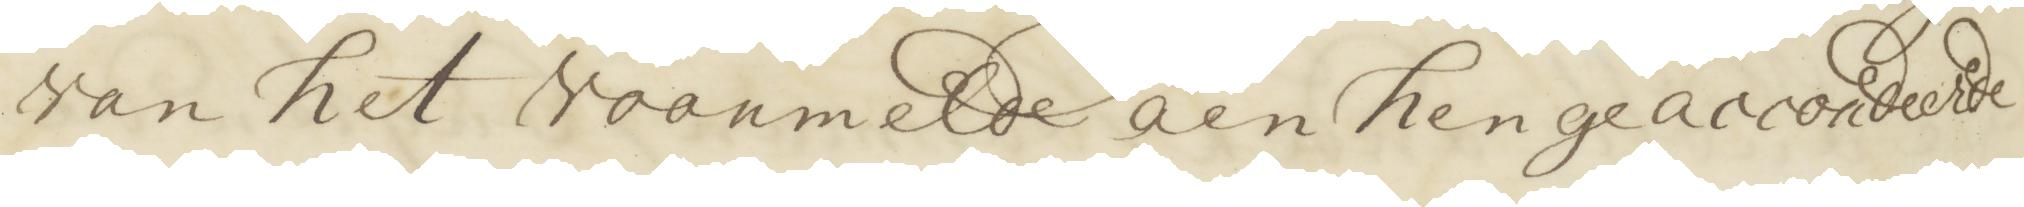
van het voormelde aen hen geaccordeerde
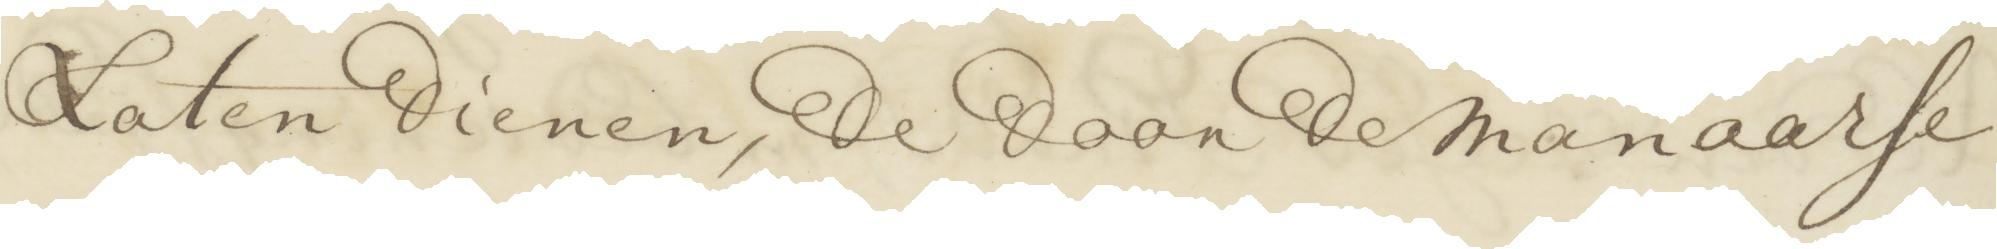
Laten dienen, de door de manaarse
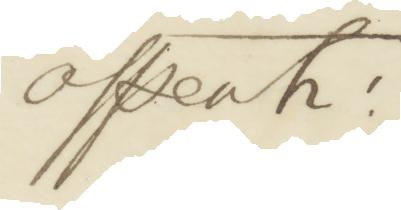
opperh:
